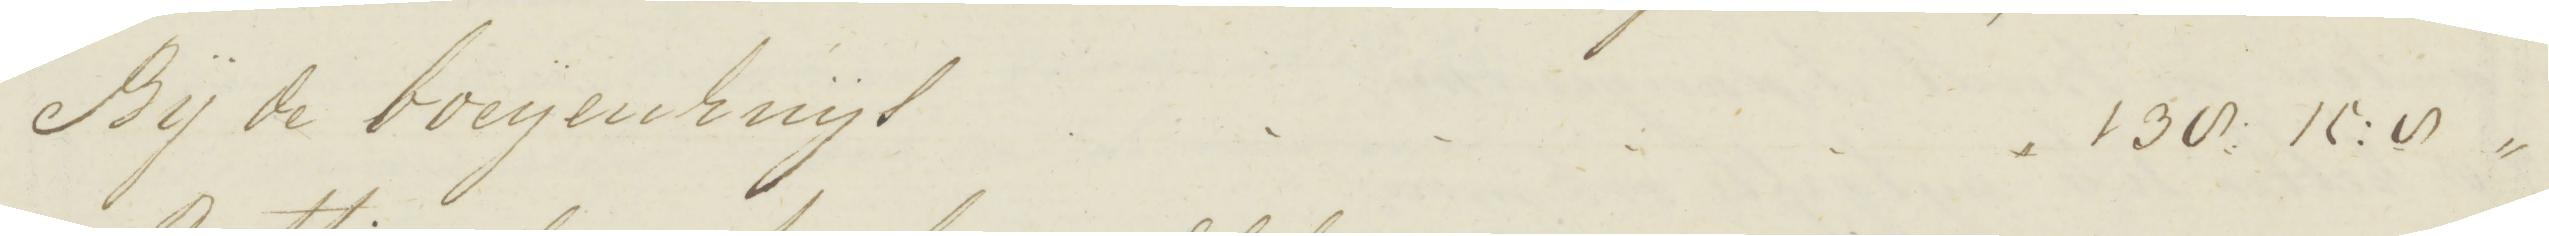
Bij de boeijenhuijs . . - . . „ 138: 15: 8 „
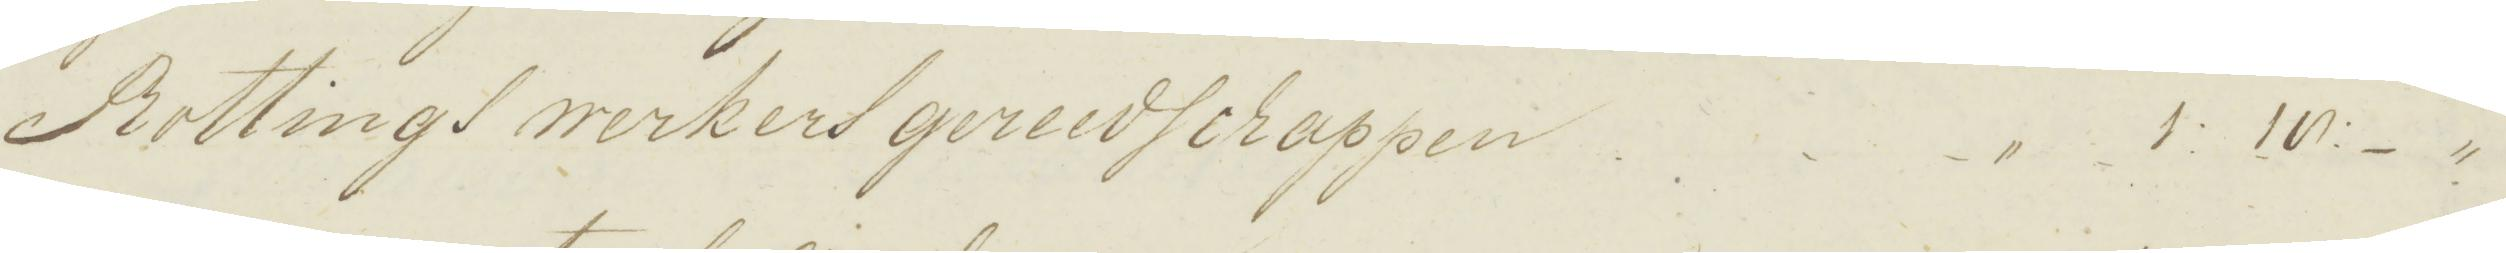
Rottings werkers gereedschappen . . - „ - 1: 18: — „
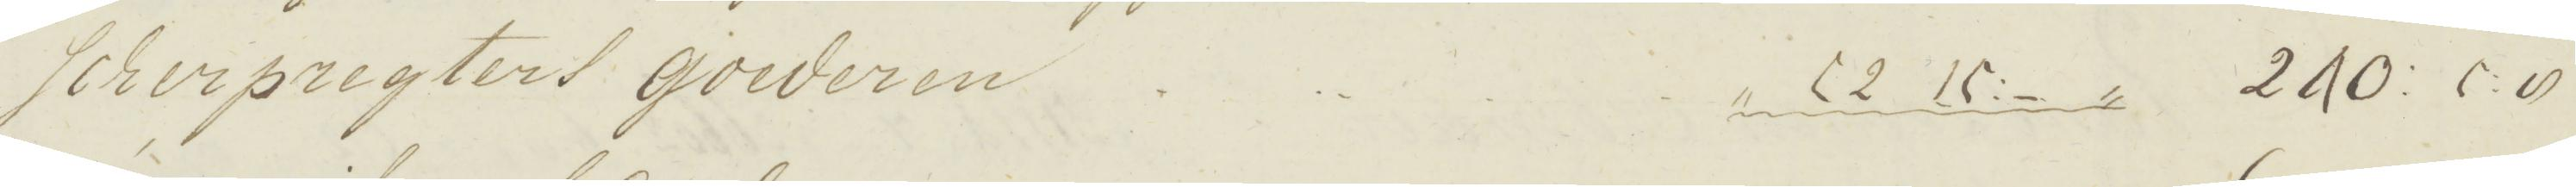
scherpregters goederen . . - . . „ 52 15: — „ 240: 5: 8
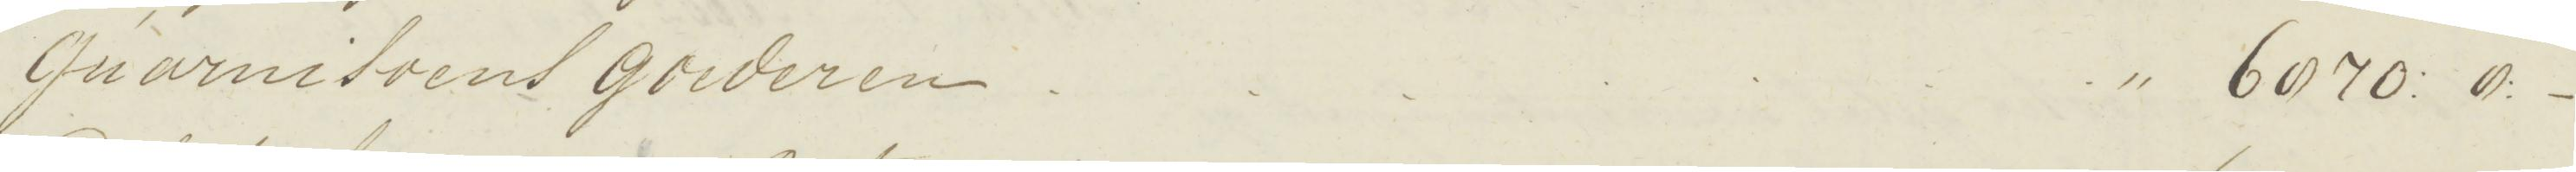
guarnisoens goederen . . . . . . . „ 6870: 8: —
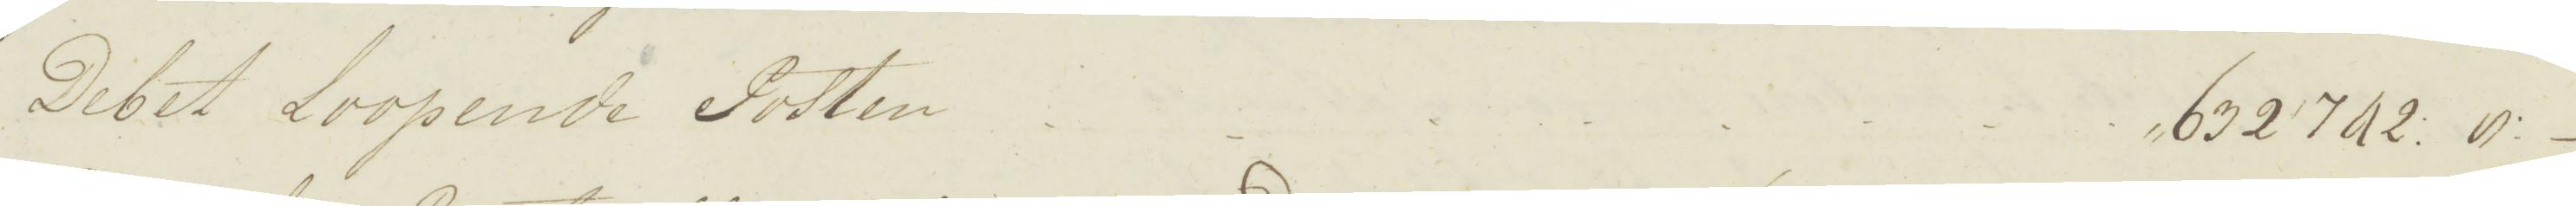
Debet loopende Posten . - . . . . - . „632'742: 8: —
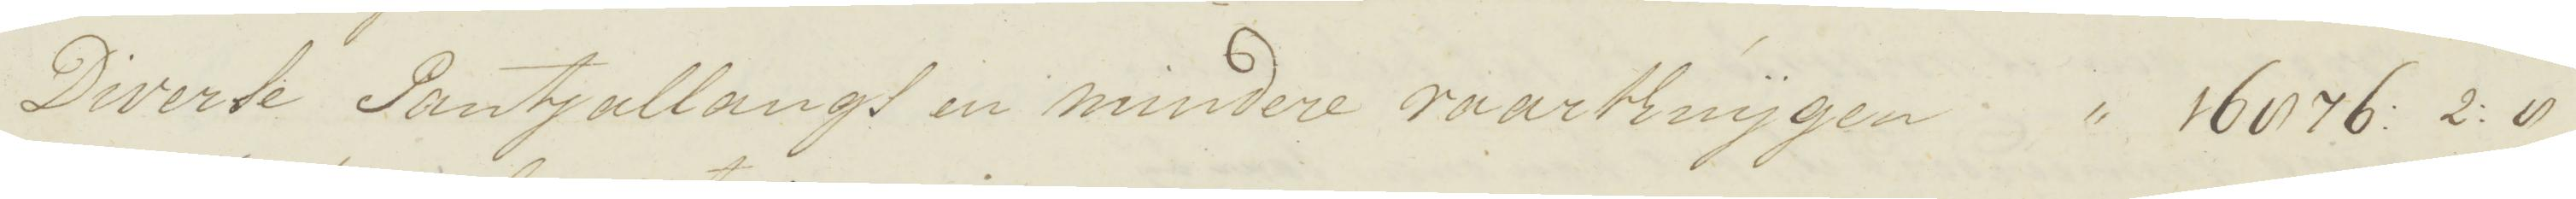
Diverse Pantjallangs en mindere vaarthuijgen „ 16876: 2: 8
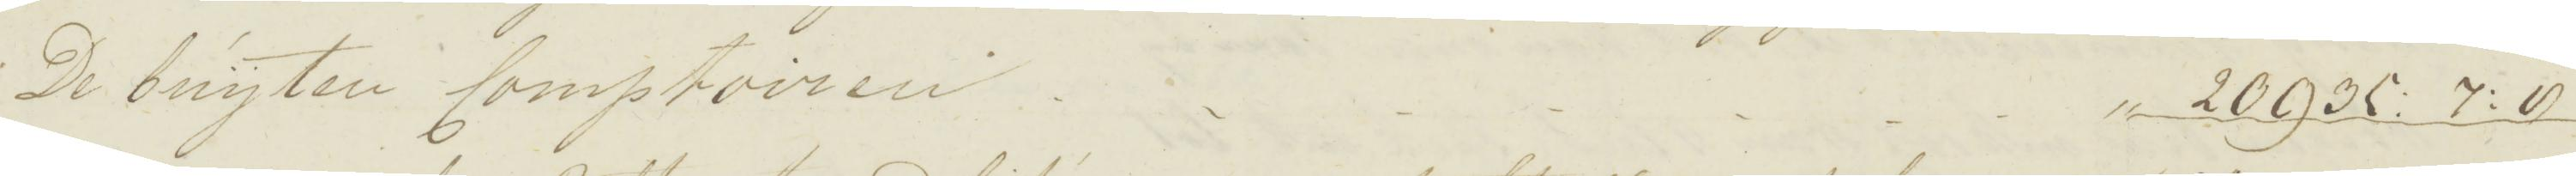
De buijten Comptoiren - - - - - - - „ 20935: 7: 8
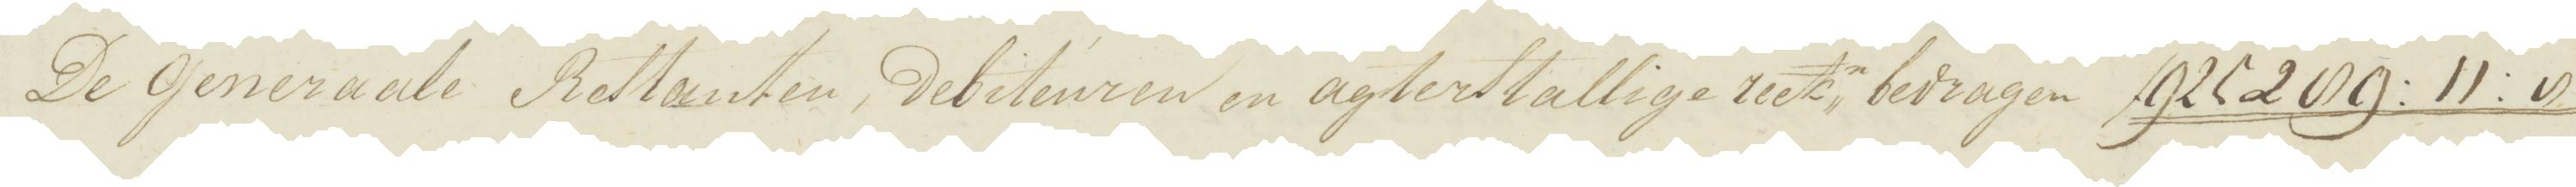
De generaale Restanten, debiteuren en agterstallige reek„n bedragen ƒ925289: 11: 8
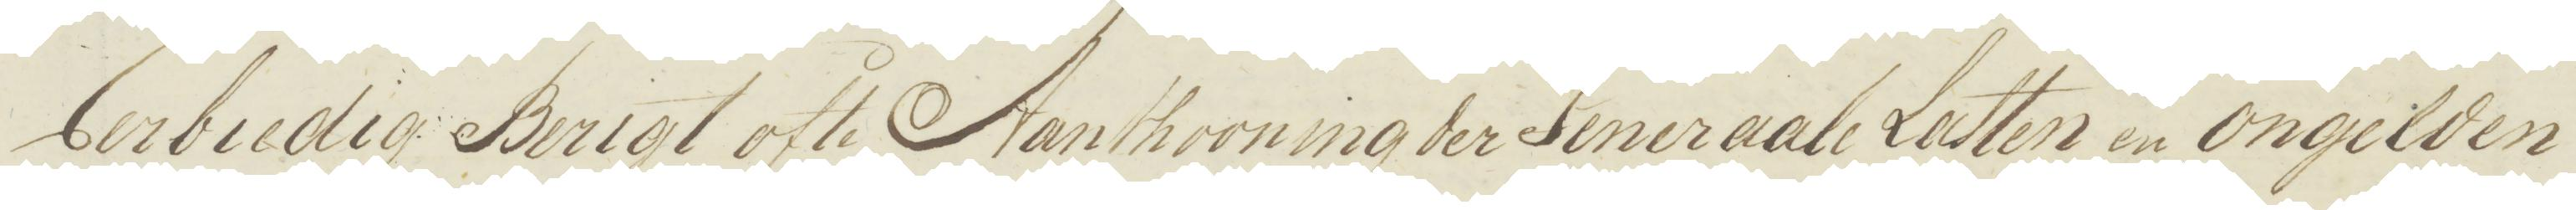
Eerbiedig Berigt ofte Aanthooning der Generaale Lasten en ongelden
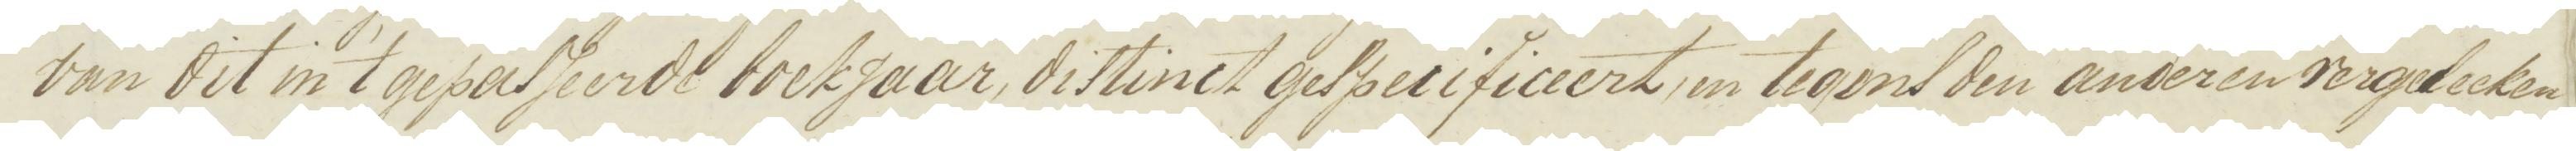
van dit in ’t gepasseerde boekjaar, distinct gespecificeert, en tegens den anderen vergeleeken
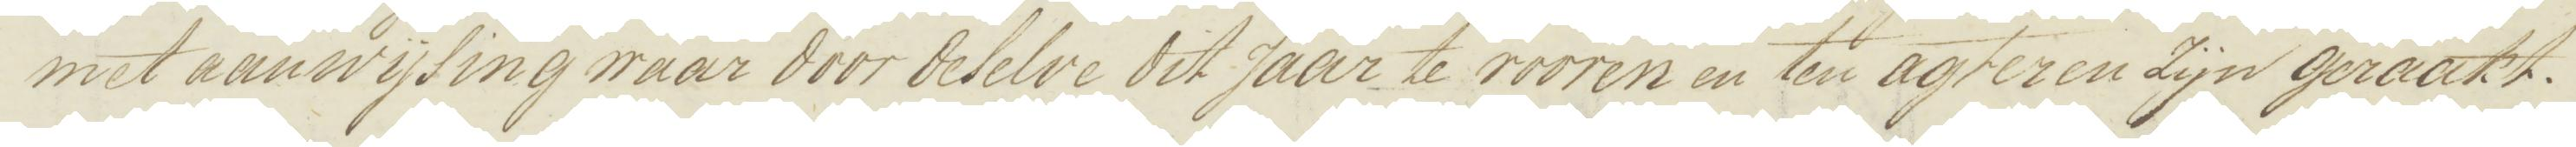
met aanwijsing waar door deselve dit jaar te vooren en ten agteren zijn geraakt.
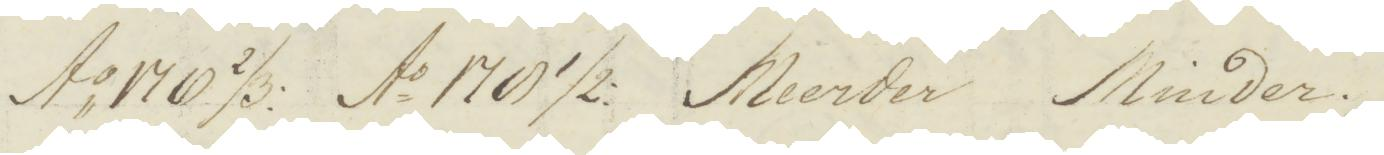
A„o 1782/3: A=o 178½: Meerder Minder.
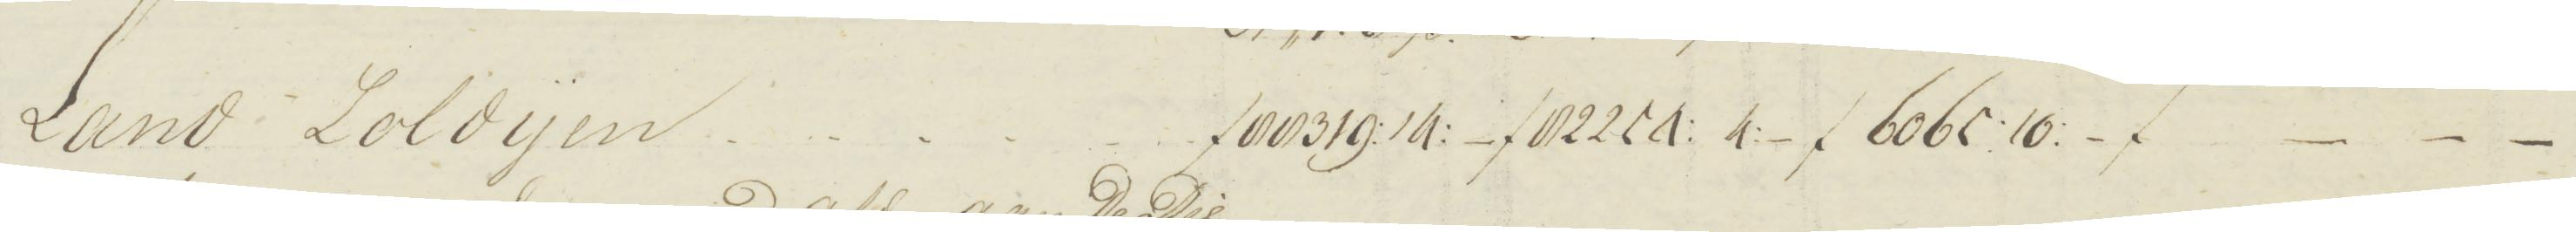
Land Zoldijen - . - - - . - . - ƒ88319:14: — ƒ82254: 4:— ƒ 6065:10: - ƒ — — —
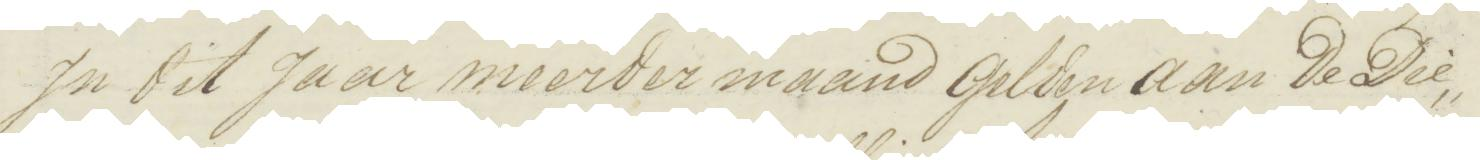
Jn dit Jaar meerder maand gelden aan de Die„
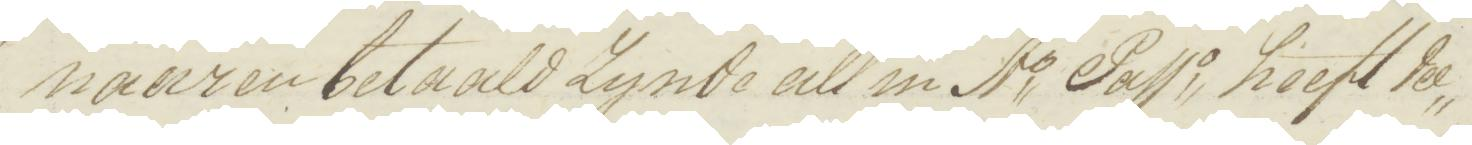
naaren betaald zynde als in A„o Pass„o heeft dee„
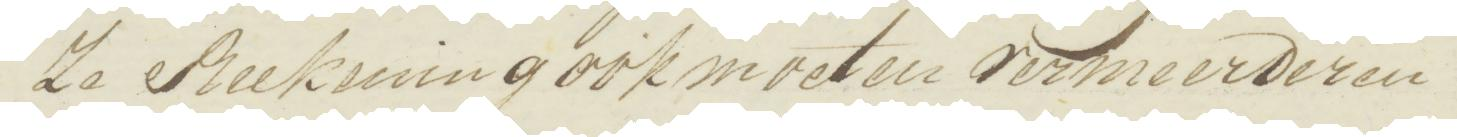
ze Reekening ook moeten vermeerderen
